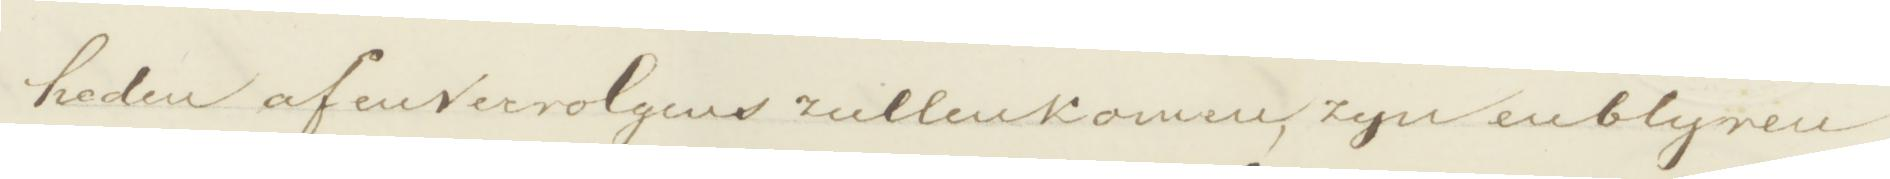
heden af en vervolgens zullen komen, zyn en blyven
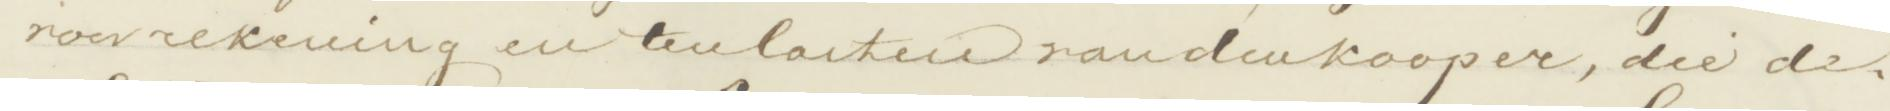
voor rekening en ten lasten van den kooper, die de,
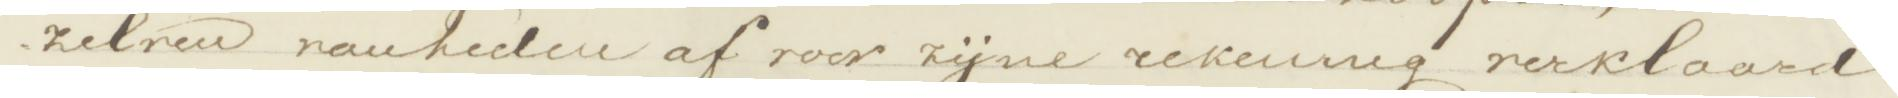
zelven van heden af voor zijne rekening verklaard
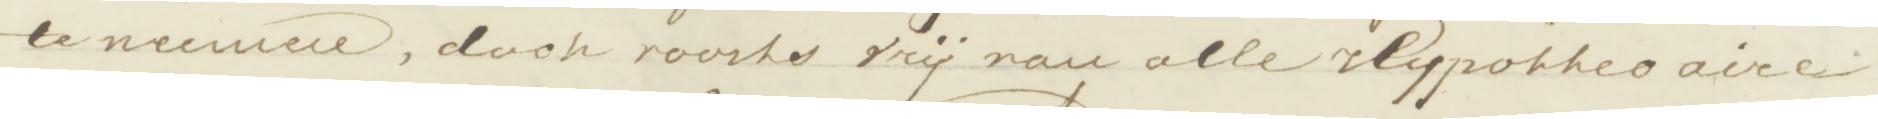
te neemen, doch voorts vrij van alle Hypothecaire
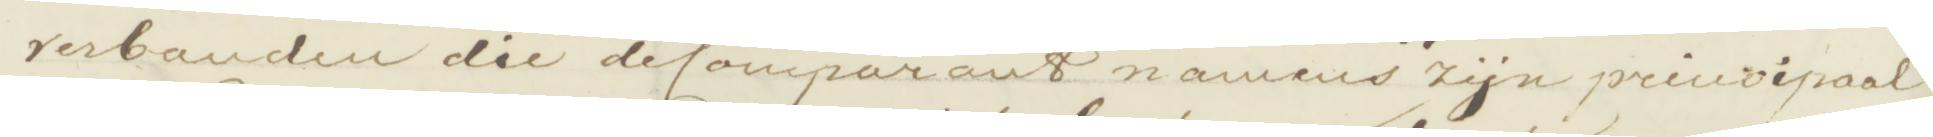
verbanden die de Comparant namens zijn principaal
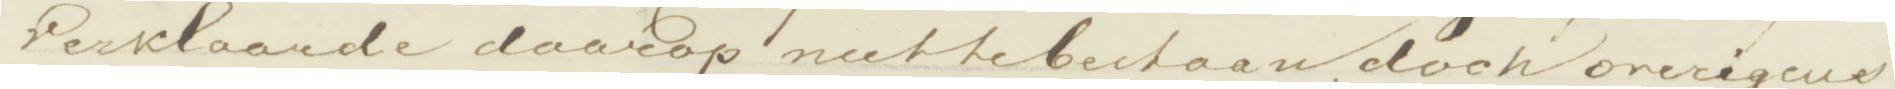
Verklaarde daarop niet te bestaan, doch overigens
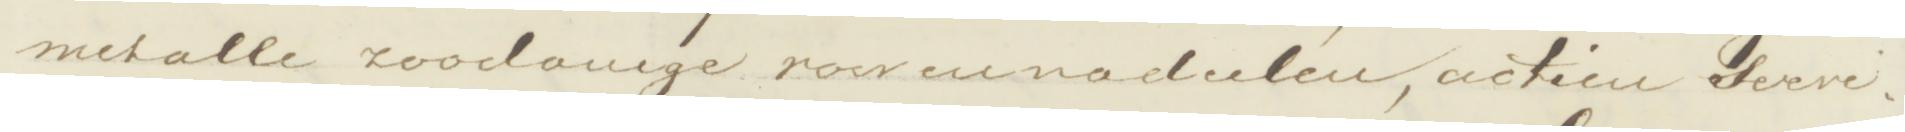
met alle zoodanige voor en nadeelen, actien serve,
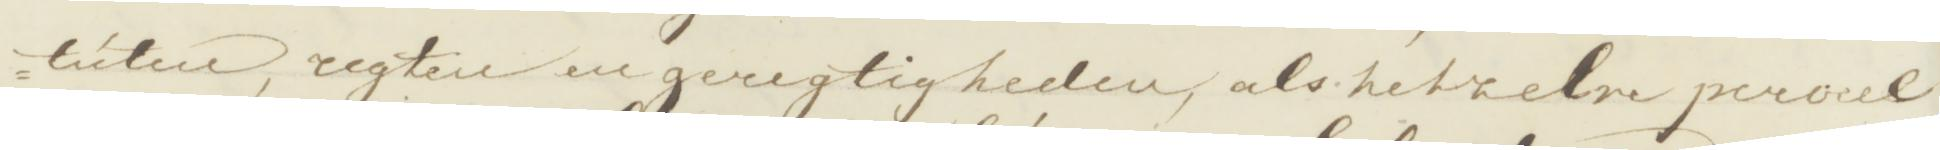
=tuten, regten en geregtigheden, als hetzelve perceel
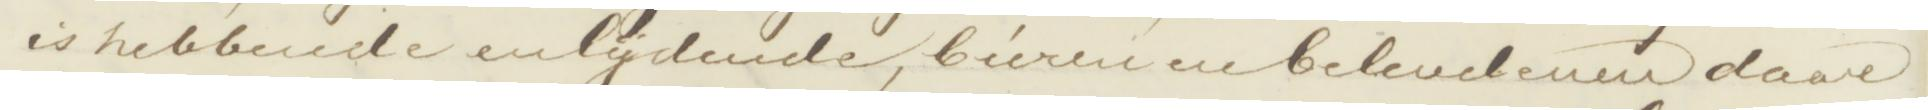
is hebbende en lijdende, buren en belendenen daar
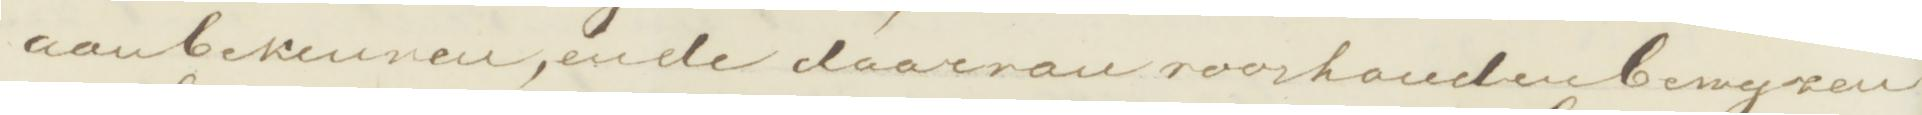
aan bekennen, ende daarvan voorhouden bewyzen
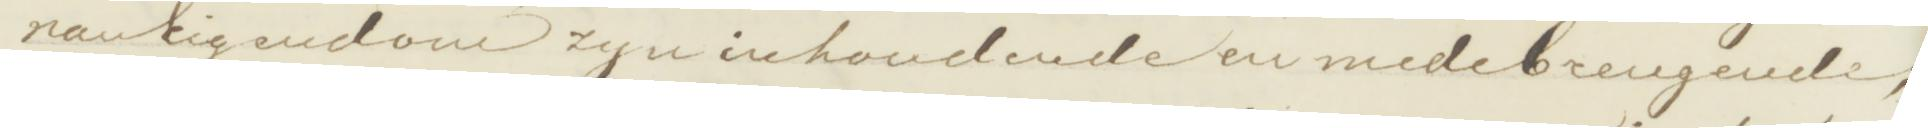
van Eigendom zyn inhoudende en medebrengende;
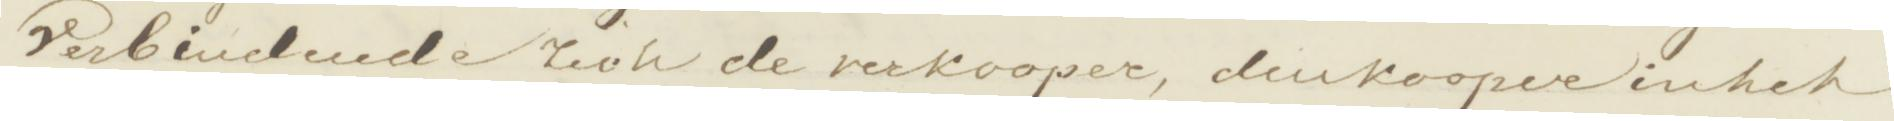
Verbindende zich de verkooper, den kooper in het
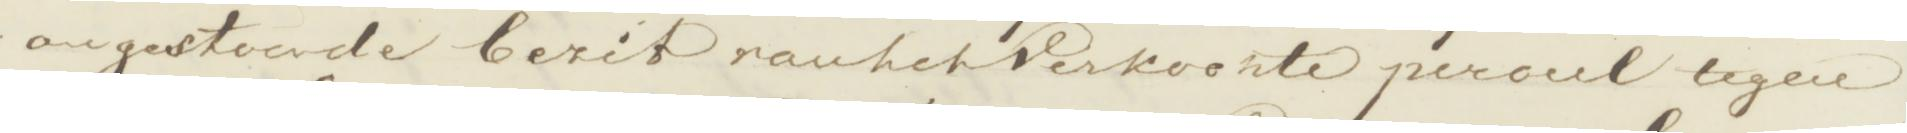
ongestoorde bezit van het Verkochte perceel tegen
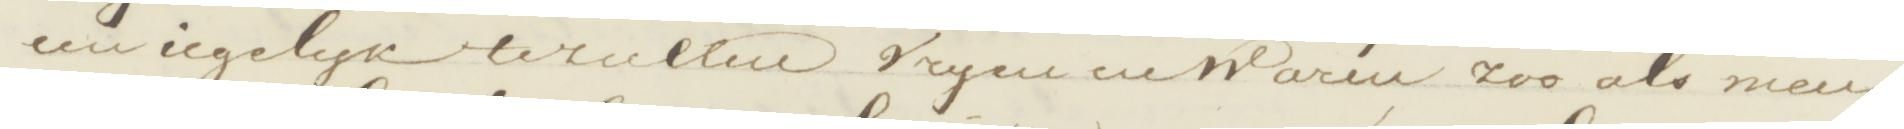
een iegelyk te zullen Vryen en Waren zoo als men
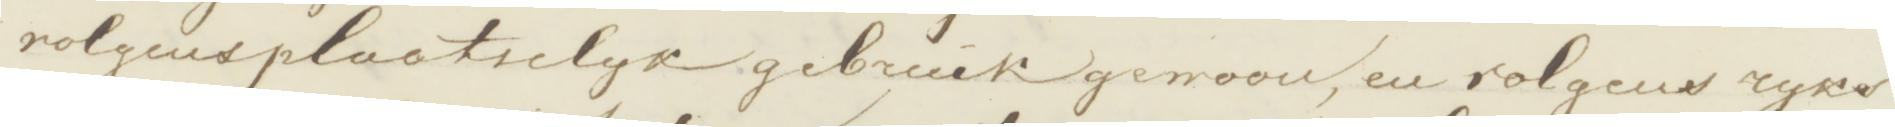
volgens plaatselyk gebruik gewoon, en volgens ryks
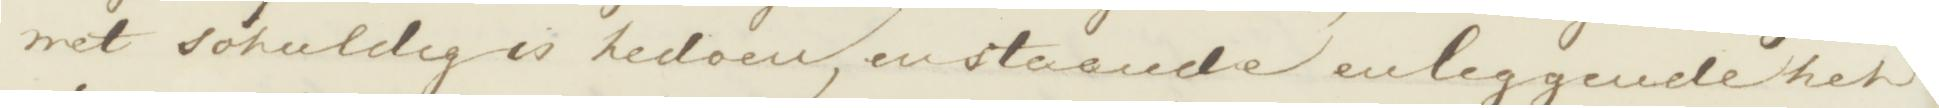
wet schuldig is te doen en staande en leggende het
